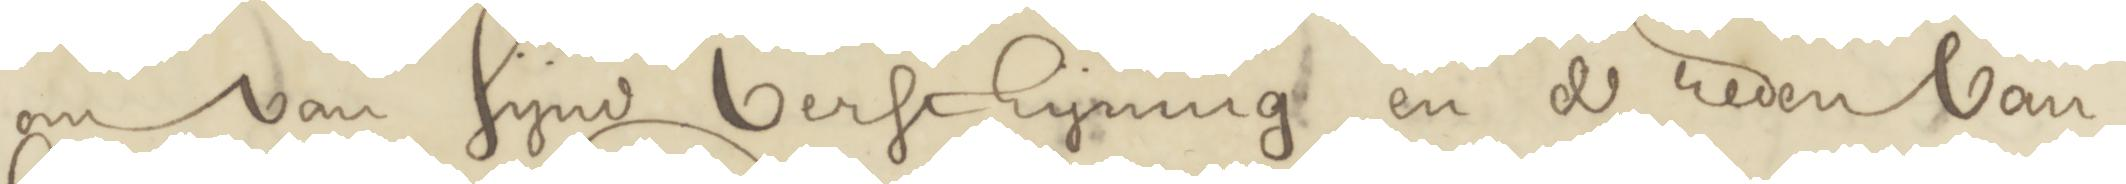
om van sijne verschijning en de reden van
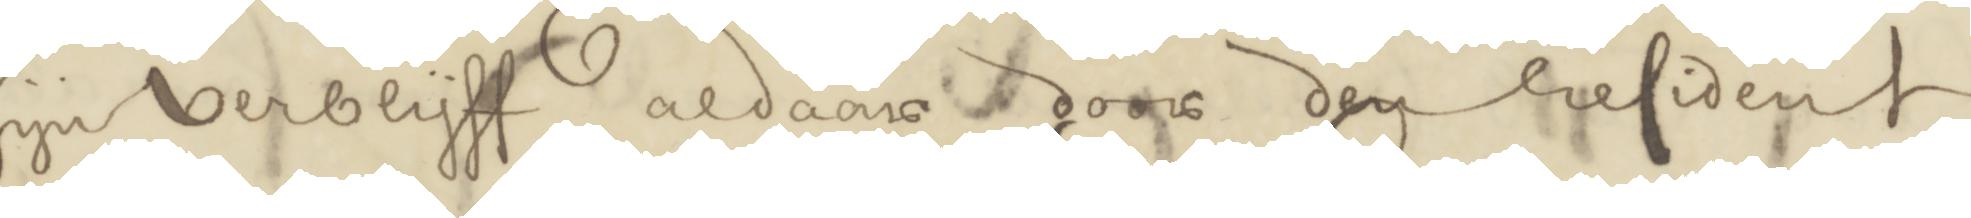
ijn verblijff aldaar door den resident
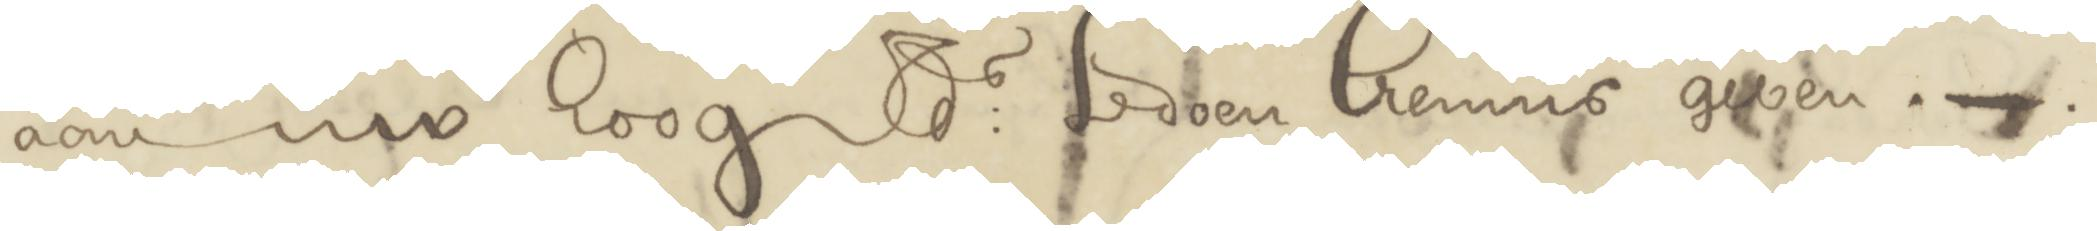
aan uw hoog Ed:s tedoen kennis geven. — .
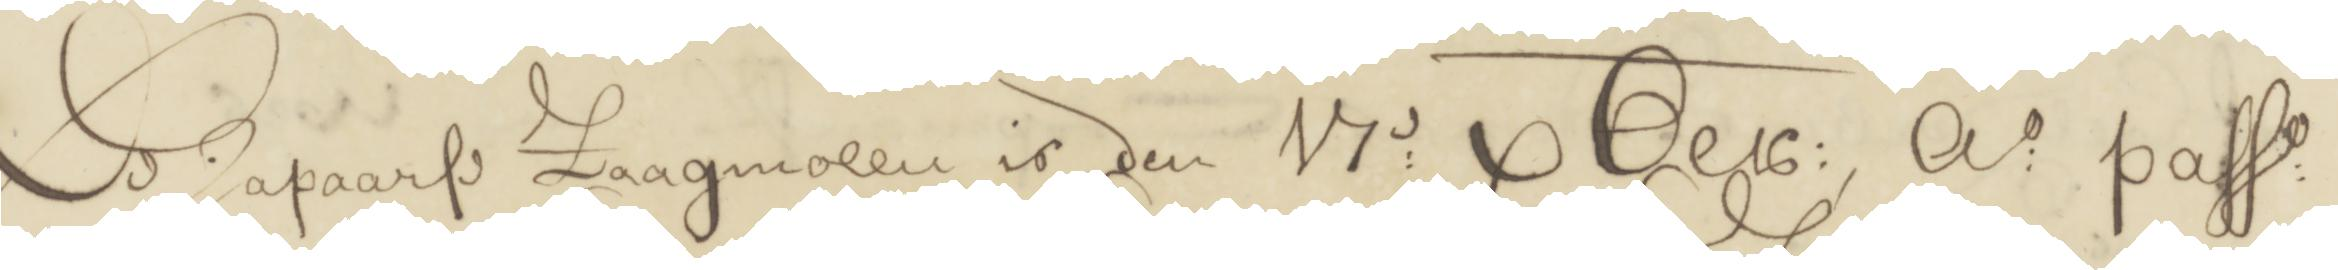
De Japaarse zaagmolen is den 17:' xber:, A:o pass:o
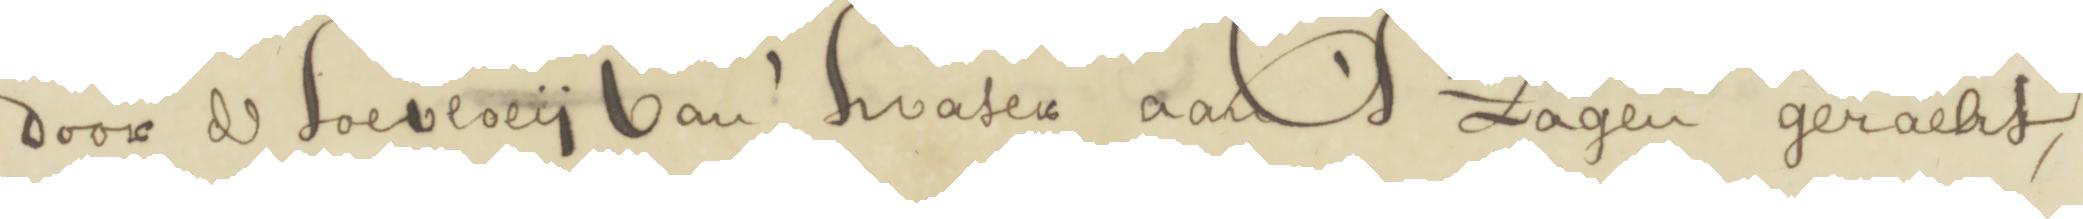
door de toevloeij van 'twater aan 't zagen geraekt,
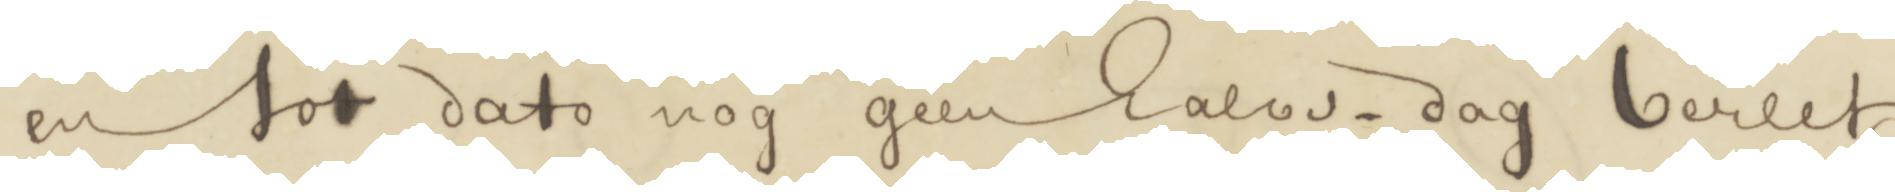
en tot dato nog geen halve-dag vereet
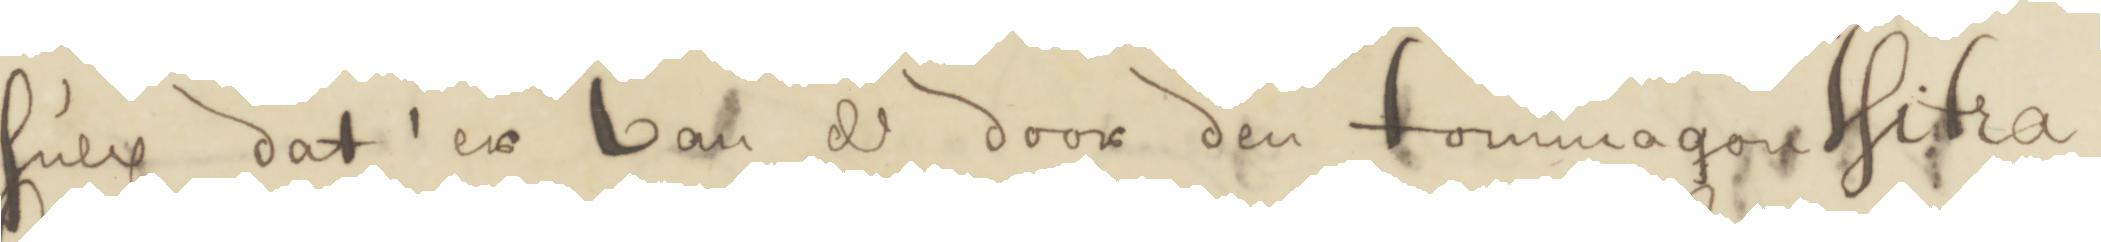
sulx dat 'er van de door den tommagon tsitra
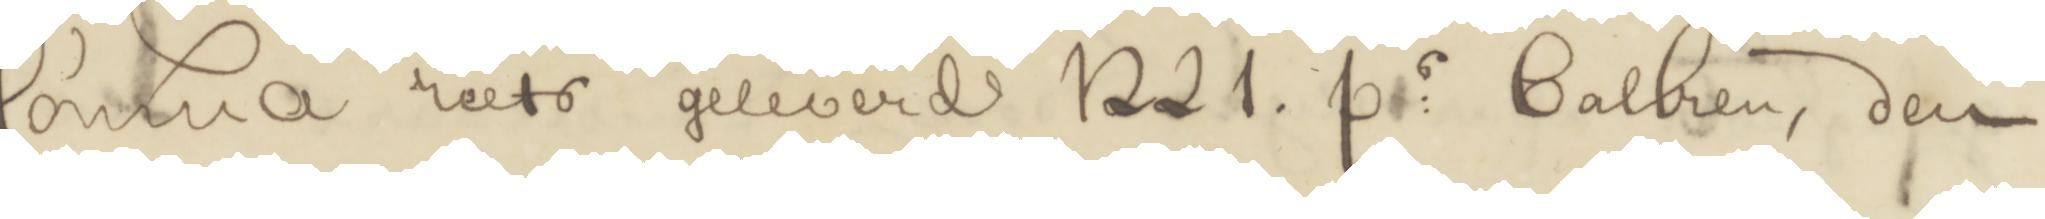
ouma reets geleverde 1221. p:s balken, den
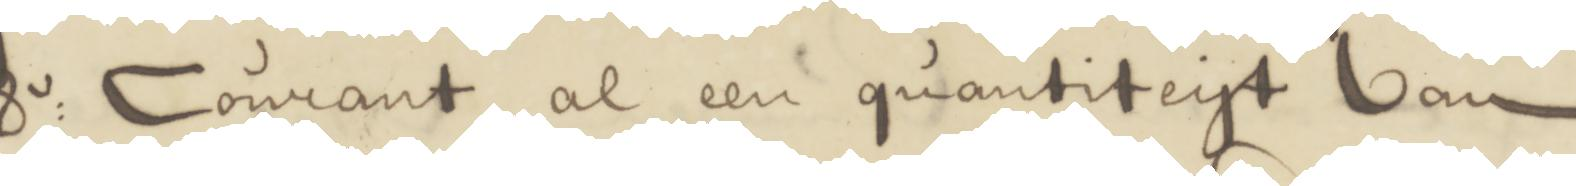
:' Courant al een quantiteijt van
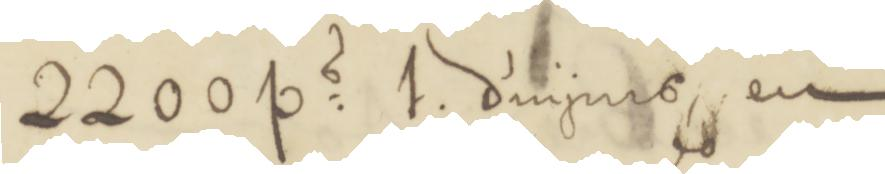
2200 p:s 1. duijms, en
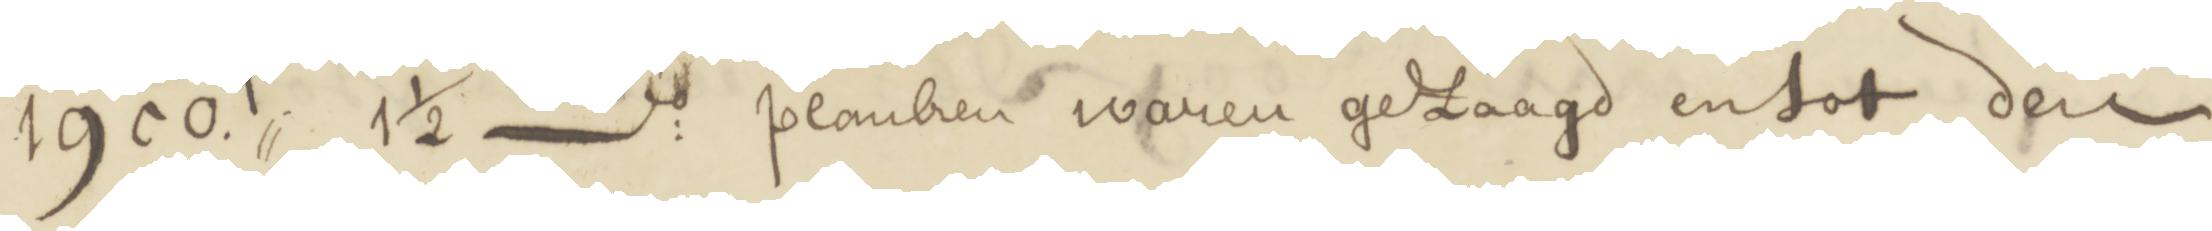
1900. „ 1½ _:o planken waren gezaagd en tot den
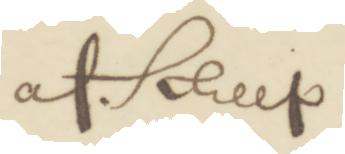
afscheep
